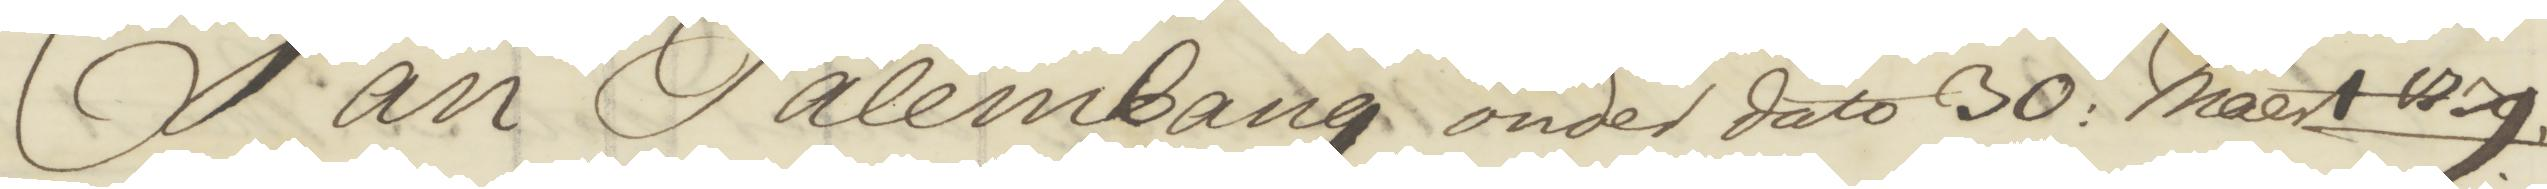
Van Palembang onder dato 30:' Maert 1779.
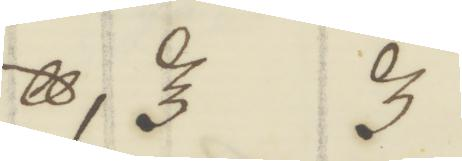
lb, 3 3
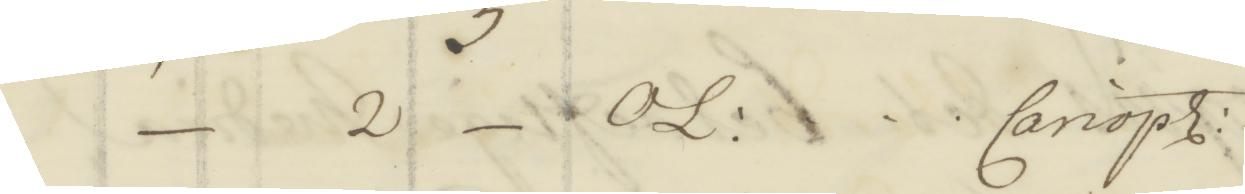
— 2 — OL - - - Canoph:
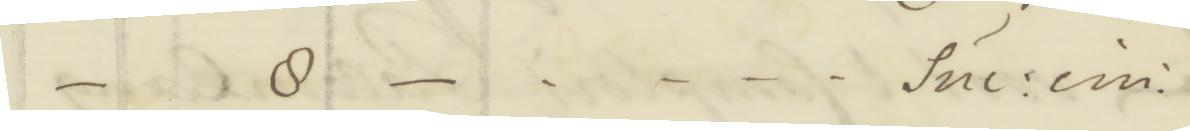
— 8 — - - - - Suc: cin:
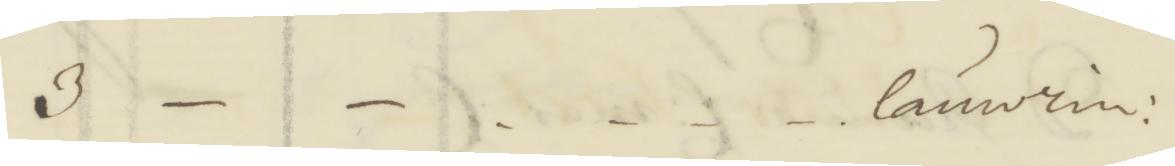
3 — — - - - - - lauwrin:
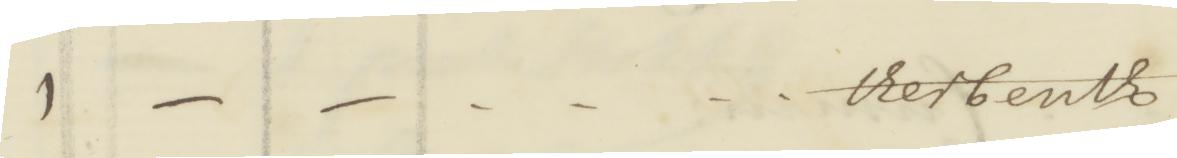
1 — — - - - - therbenth
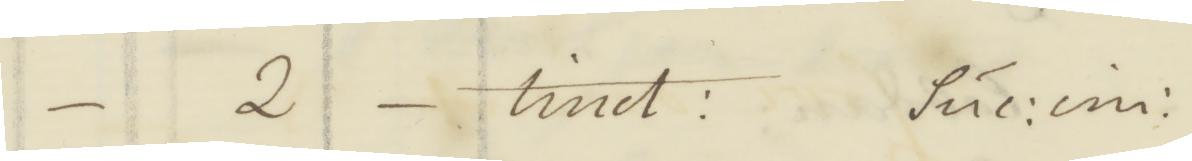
— 2 — tinct: Suc: cin:
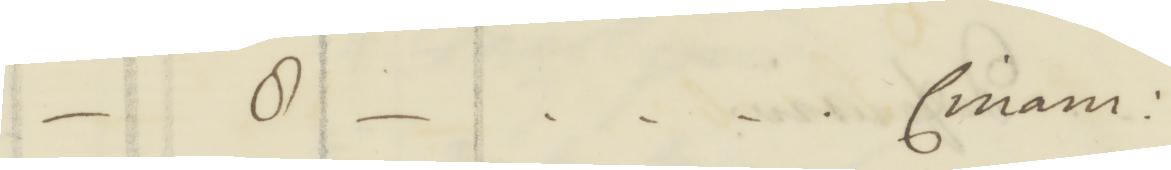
— 8 — - - - - Cinam:
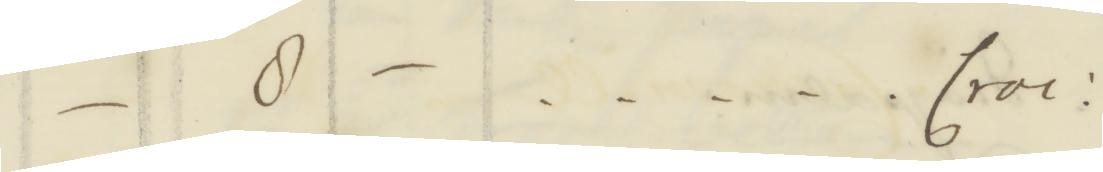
— 8 — - - - - - Croc:
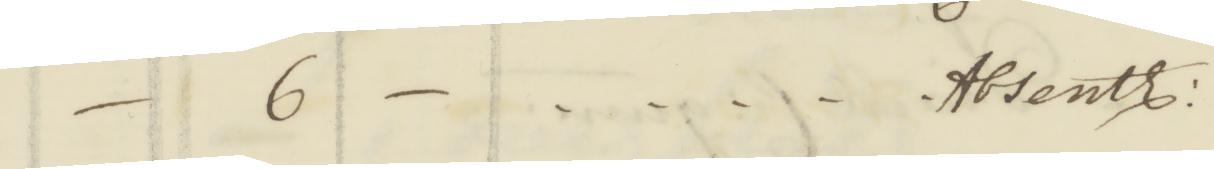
— 6 — - - - - - Absenth:
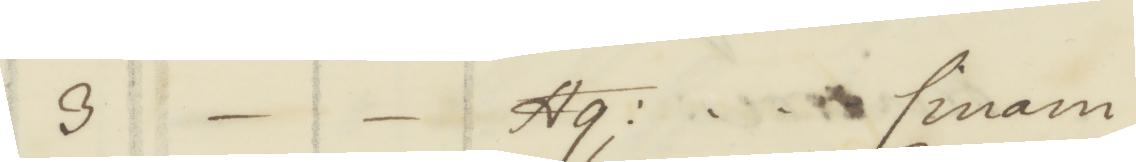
3 — — Aq: - - - Cinam
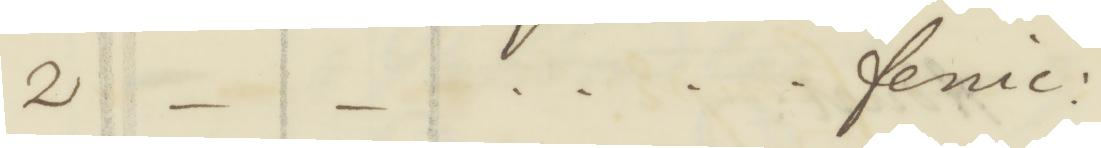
2 — — - - - - fenic:
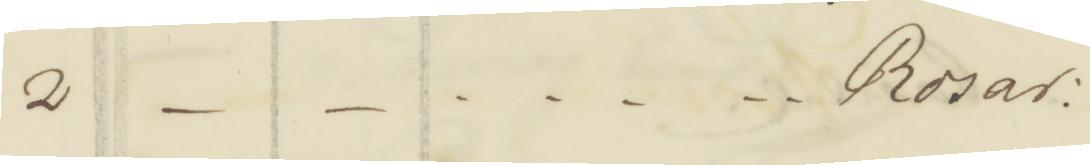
2 — — - - - - - Rosar:
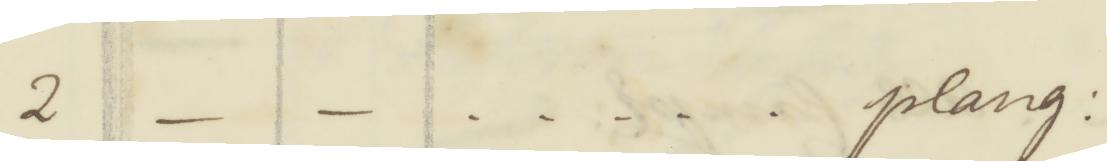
2 — — - - - - - plang:
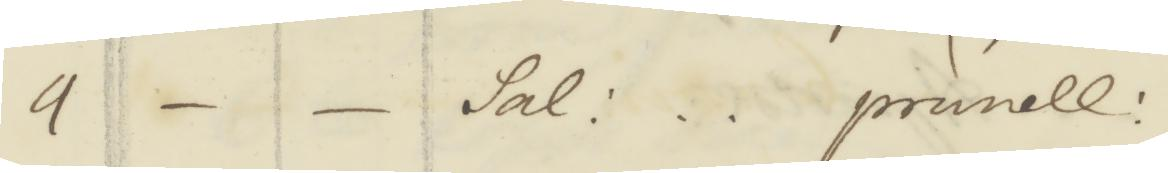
4 — — Sal: - - prunell:
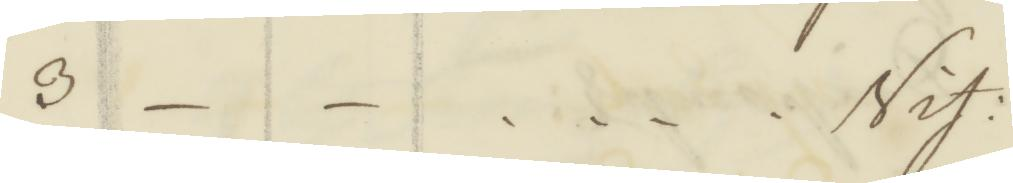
3 — — - - - - Nif:
